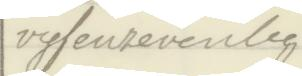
vyfenzeventig
